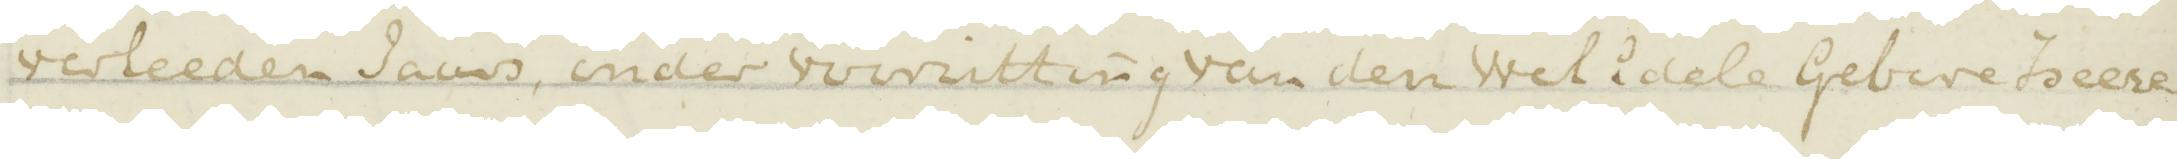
verleeden Iaars, onder voorzitting van den Wel Edele Gebore Heere
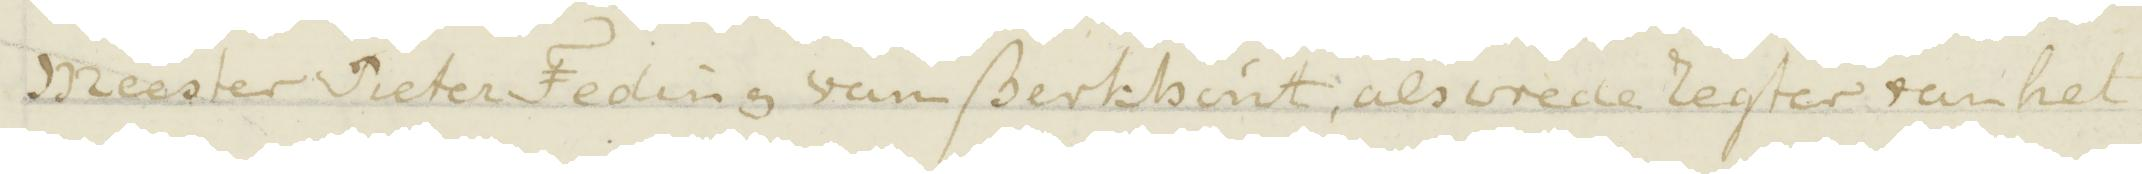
Meester Pieter Teding van Berkhout, als vrede regter van het
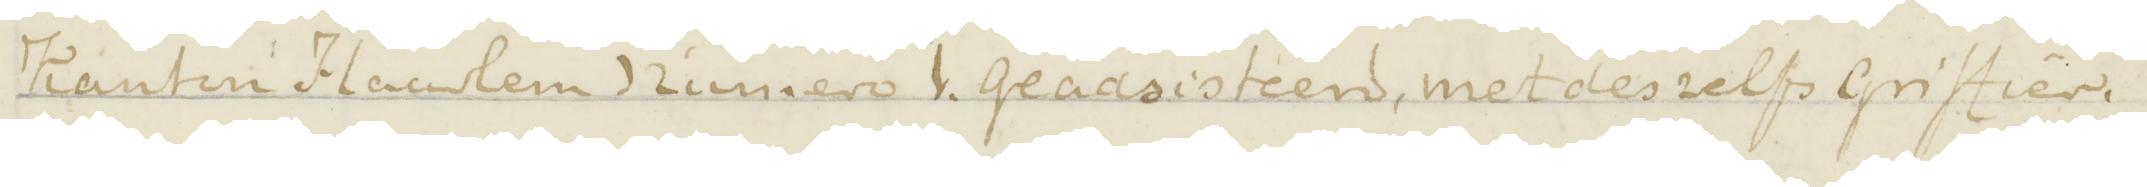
Kanton Haarlem Numero 1. geadsisteerd, met deszelfs Griffier
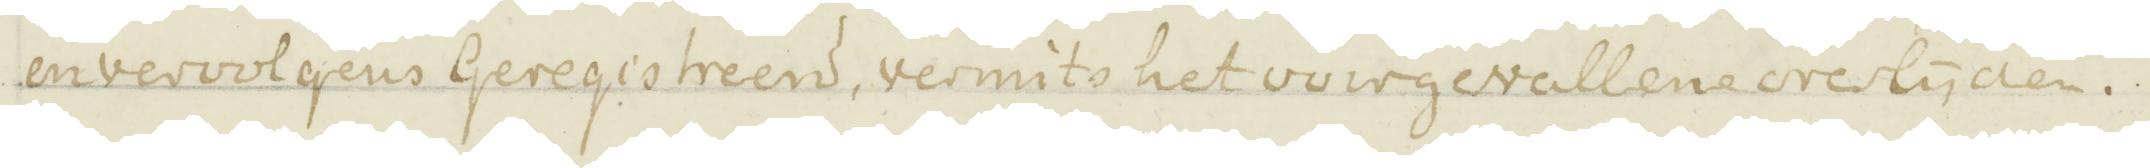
en vervolgens Geregistreerd, vermits het voorgevallene overlijden.
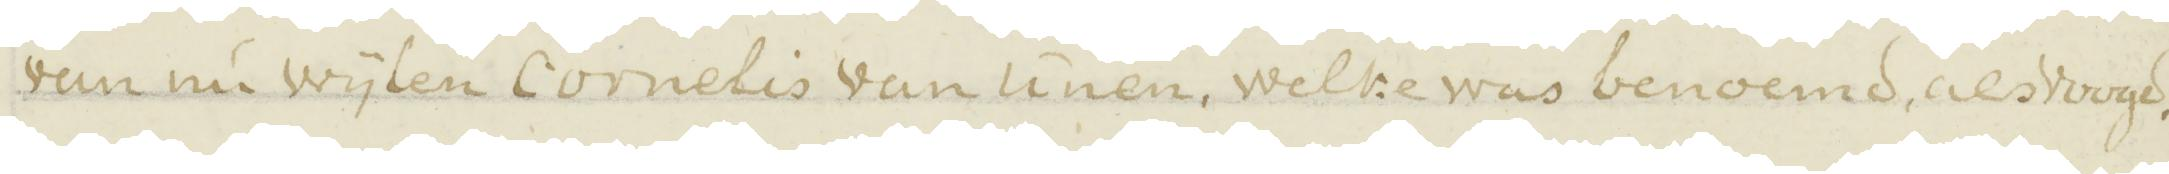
van nu wijlen Cornelis van Unen, welke was benoemd, als Voogd
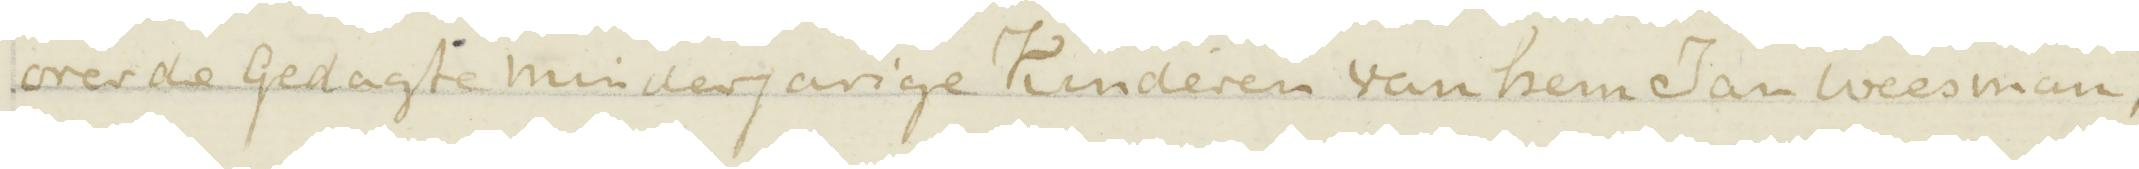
over de gedagte minderjarige Kinderen van hem Ian weesman,
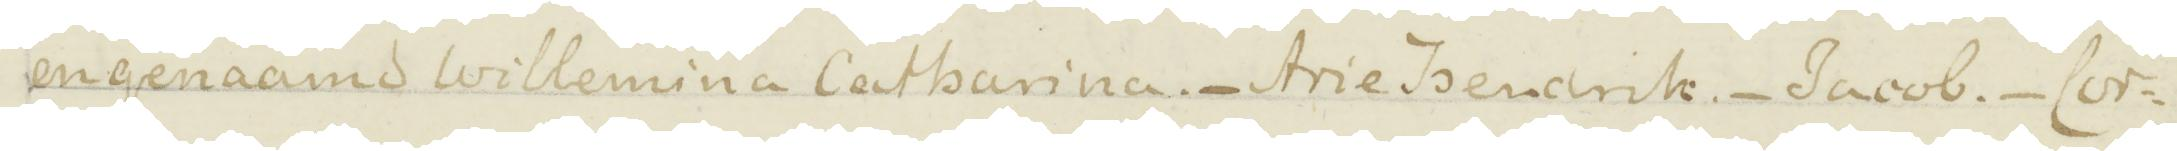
en genaamd Willemina Catharina.— Arie Hendrik,— Iacob.— Cor=
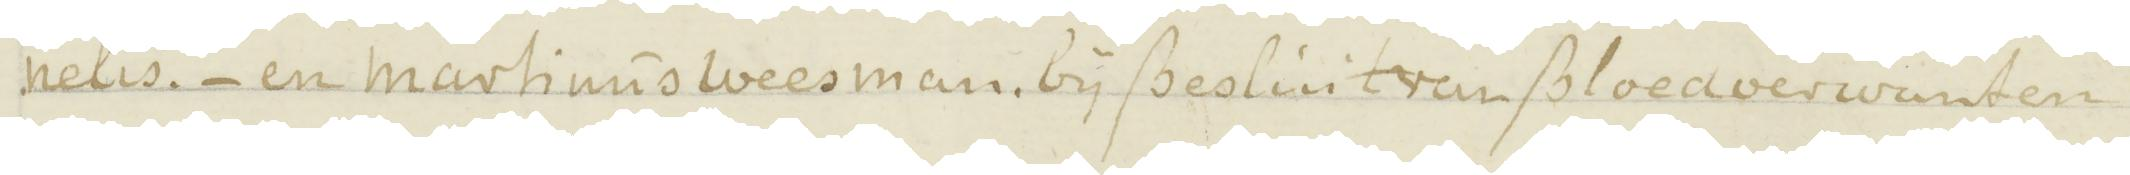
nelis.— en martinus weesman. bij Besluit van Bloedverwanten
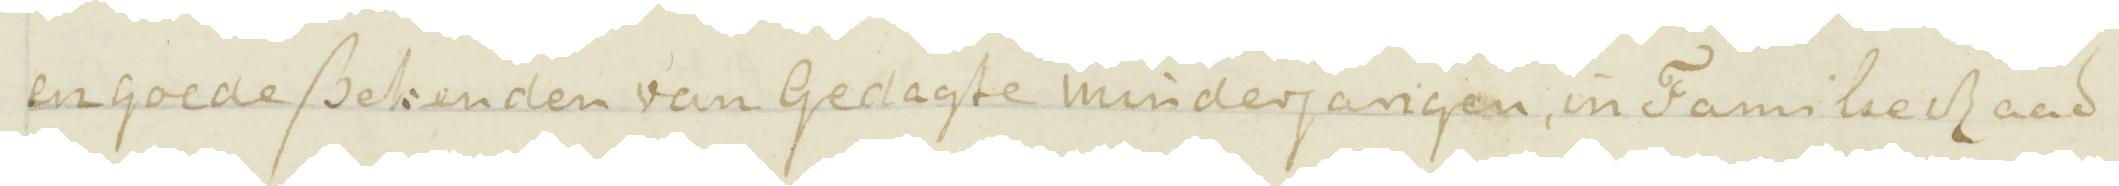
en goede Bekenden van Gedagte minderjarigen, in FamilieRaad
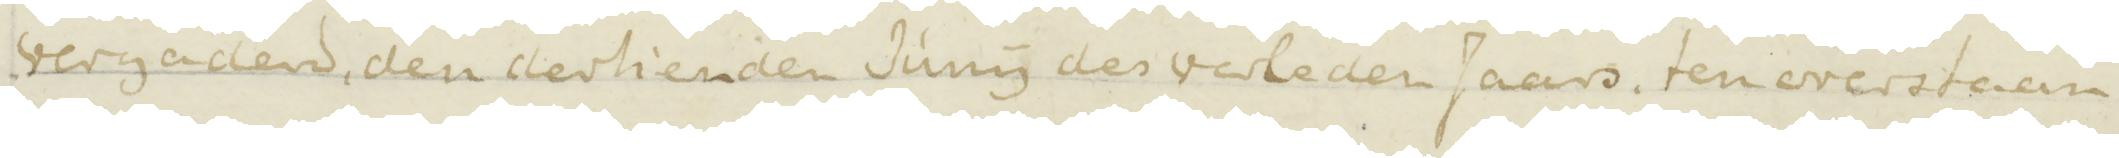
vergaderd, den dertienden Iunij des verleden Jaars, ten overstaan
